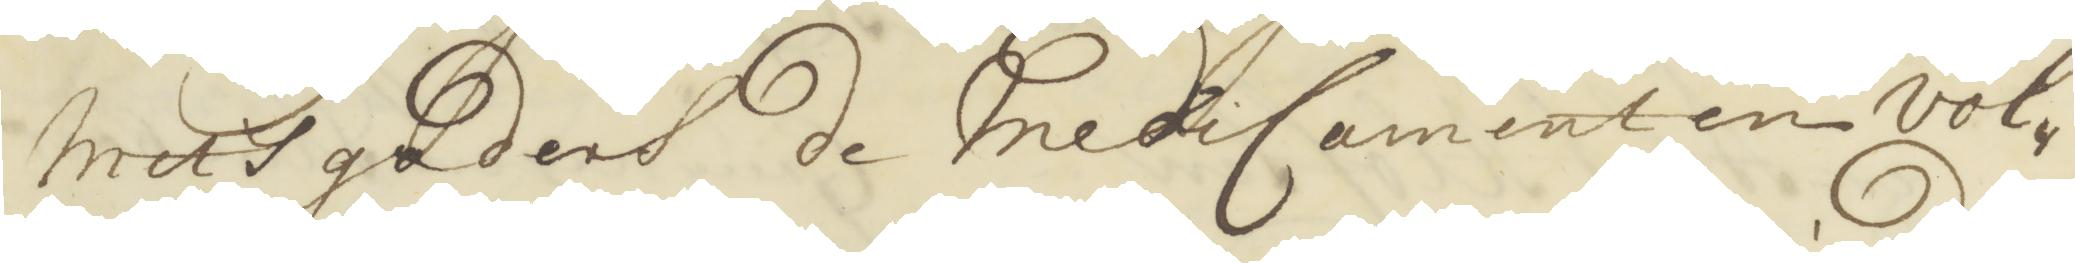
mitsgaders de medicament en vol„
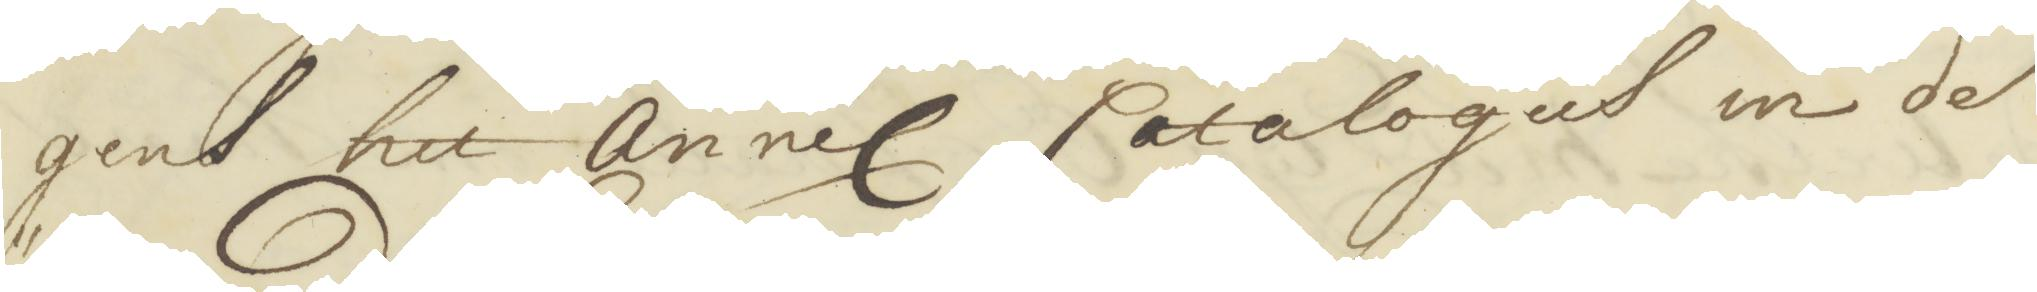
„gens het annex Catalogus in de
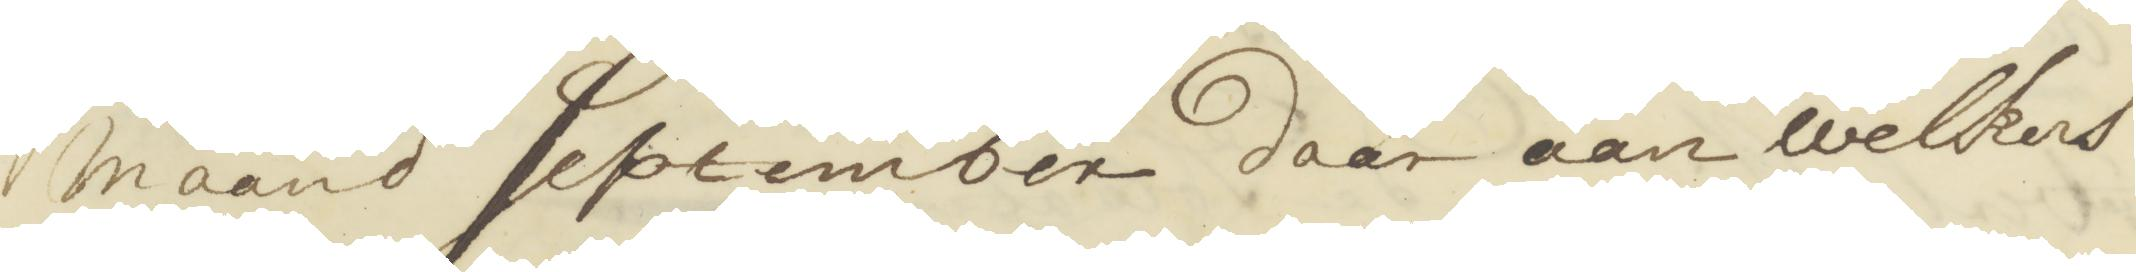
maand september daar aan welkers
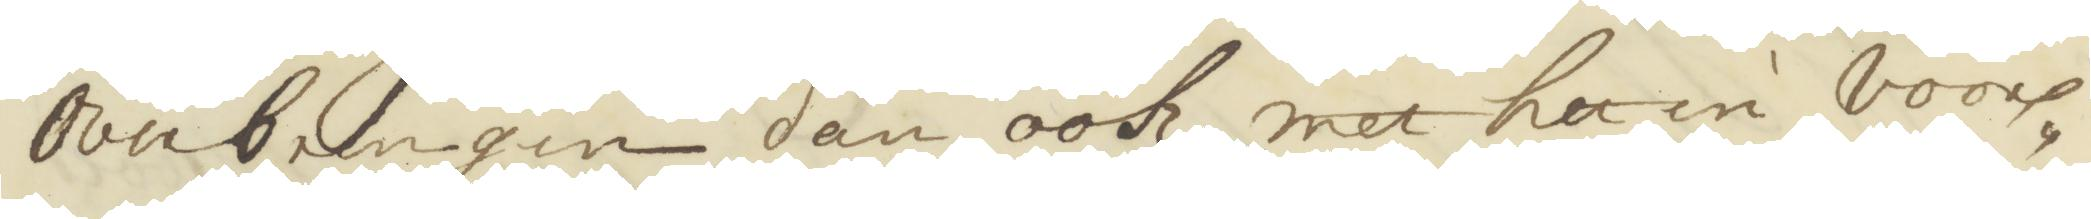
overbrengen dan ook met het in voor„
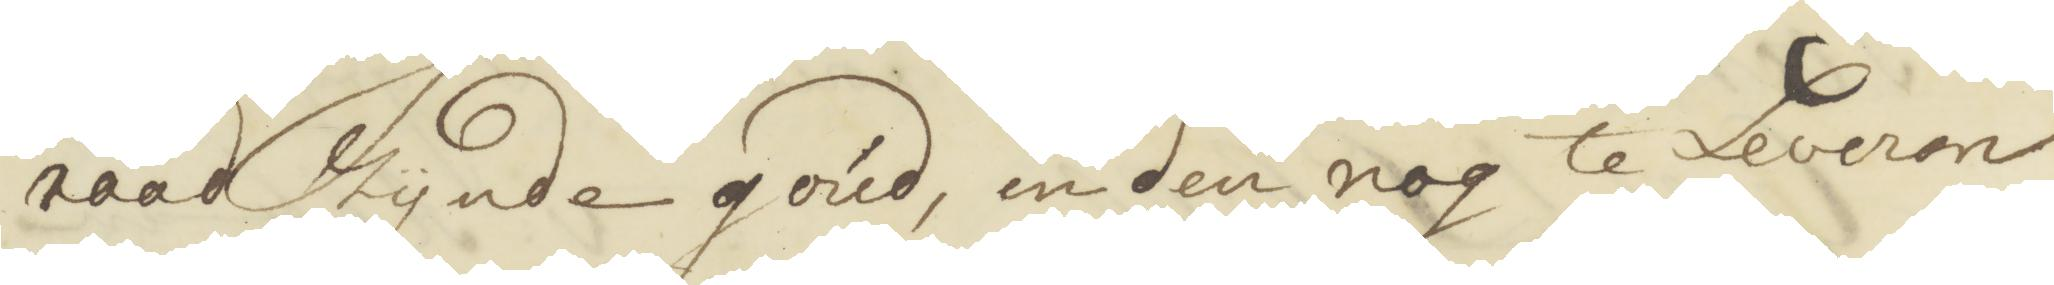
raad zijnde goud, en den nog te Leveren
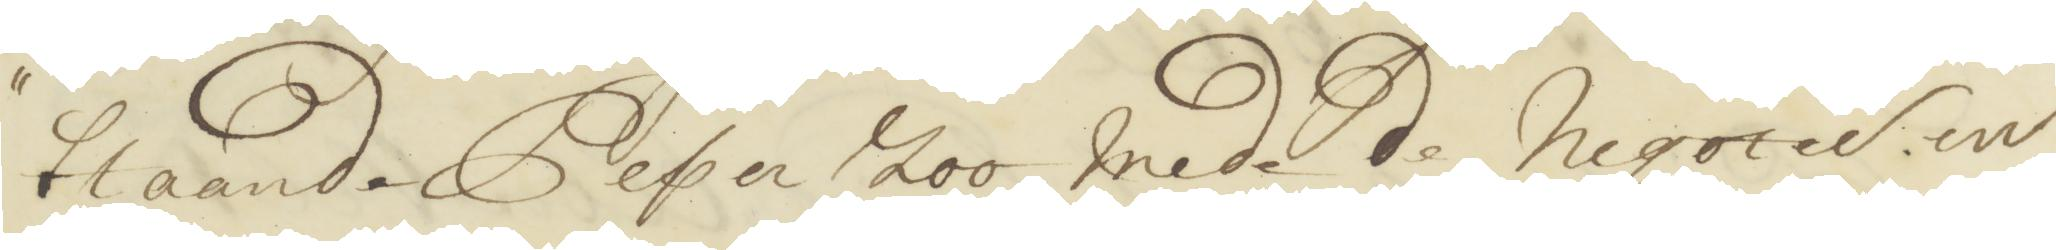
staande Peper zoo mede de negotie en
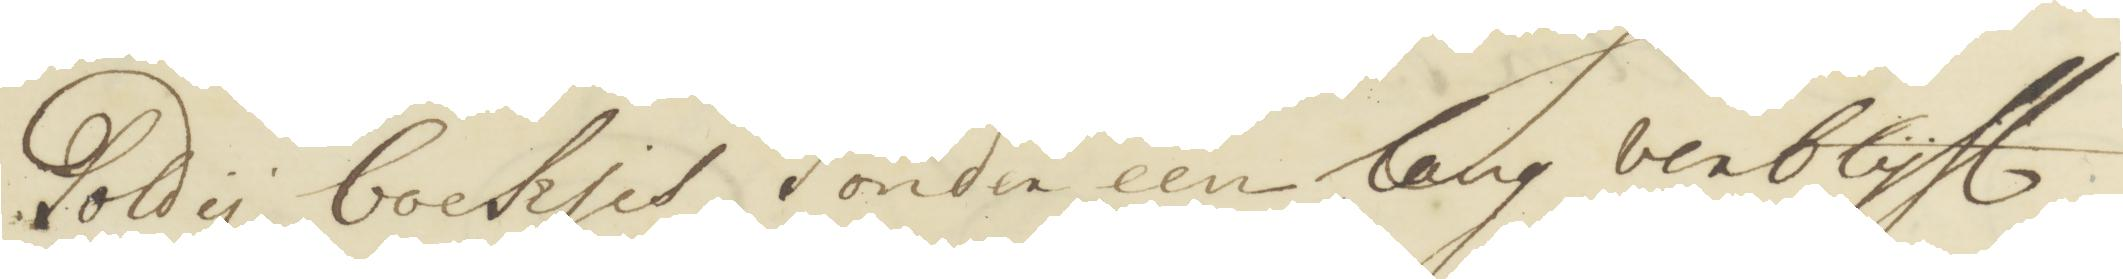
soldij boekjes sonder een lang verblijft
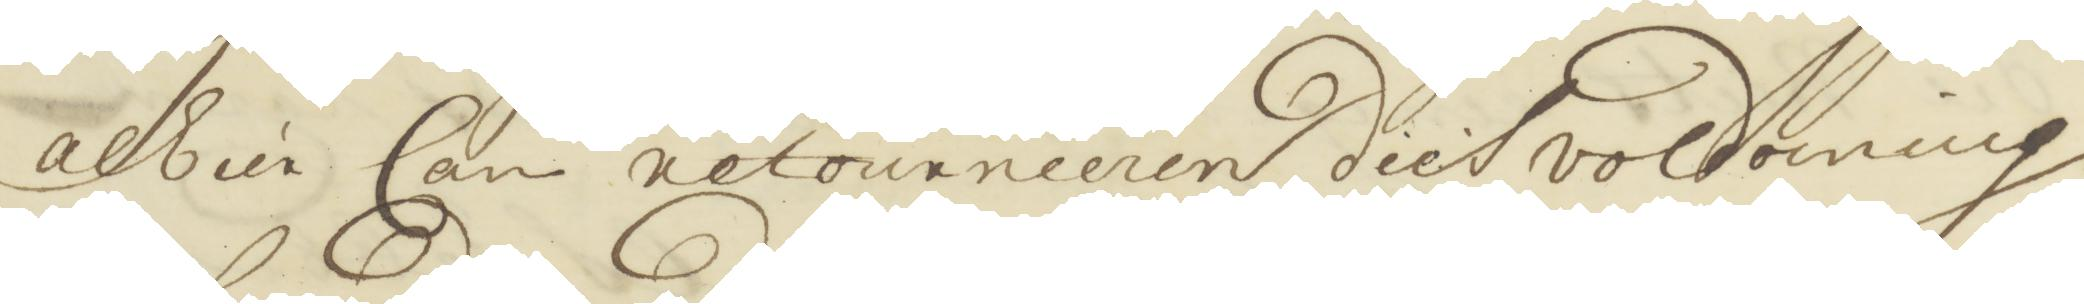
alhier Can retourneeren dies voldoening
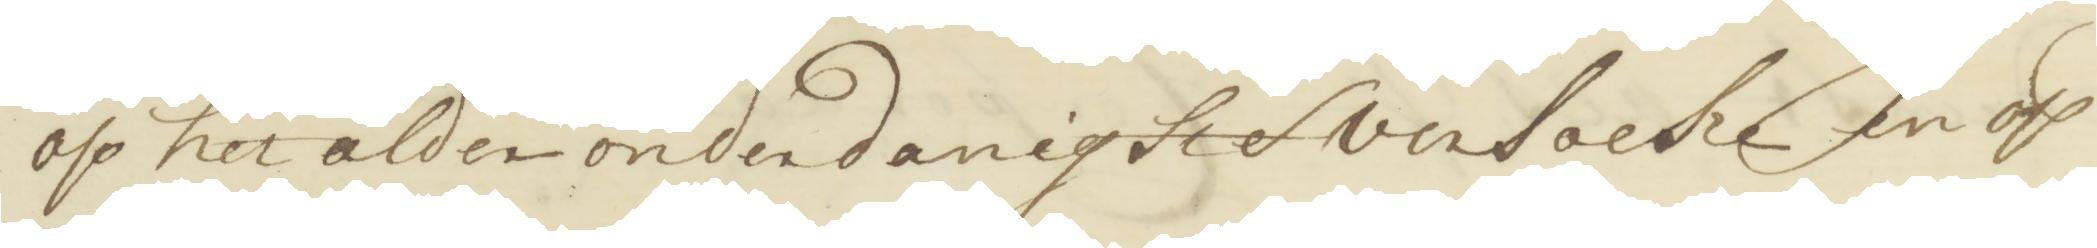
op het alder onderdanigste versoeke en op
